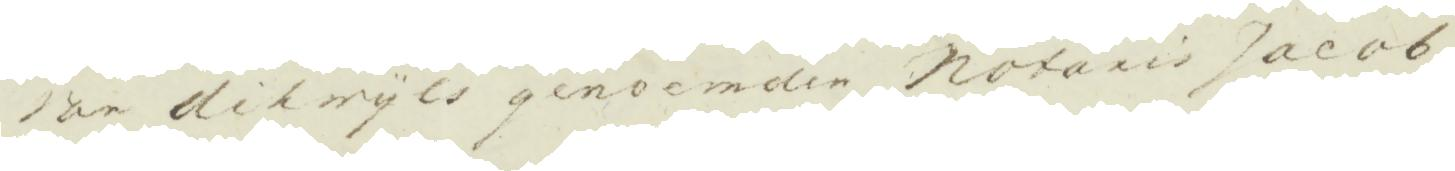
van dikwijls genoemden Notaris Jacob
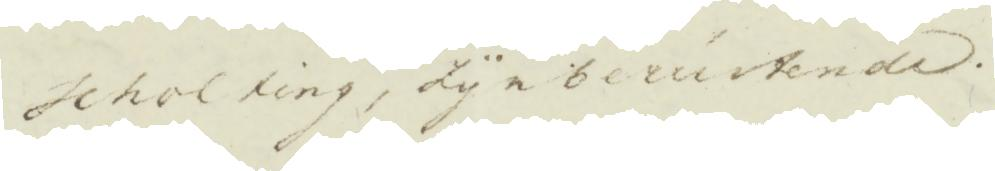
scholting, zijn berustende.
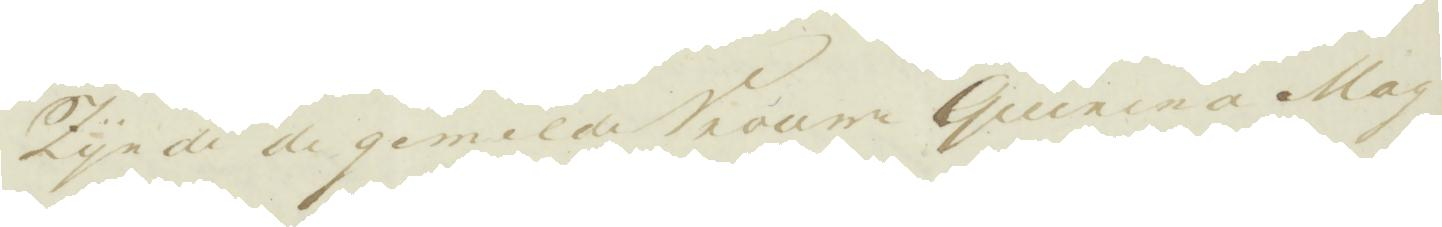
Zijnde de gemelde Vrouwe Quirina Mag
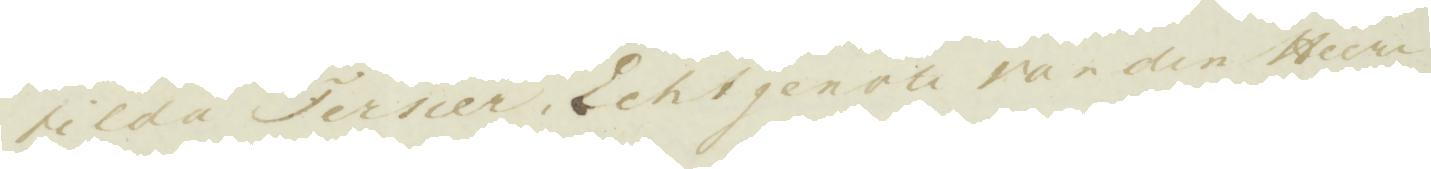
tilda Fersier, Echtgenote van den Heere
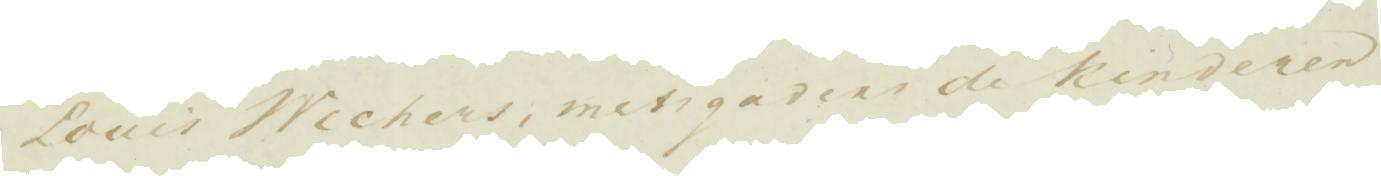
Louis Wichers, mitsgaders de kinderen
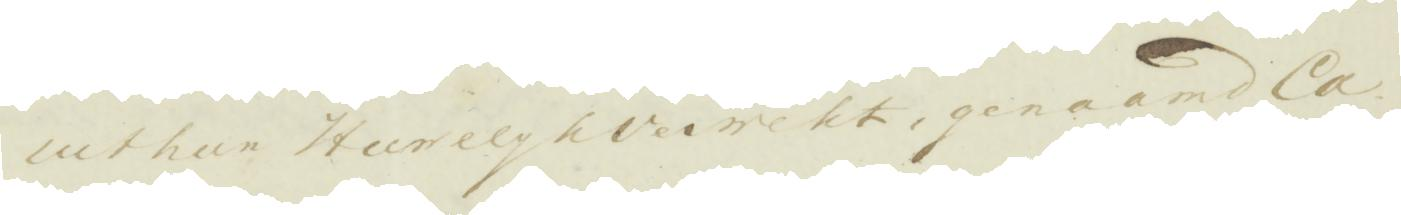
uit hun Huwelyk verwekt, genaamd Ca
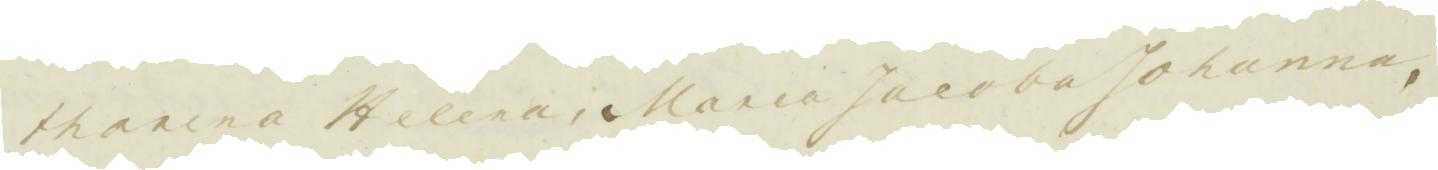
tharina Helena, Maria Jacoba Johanna,
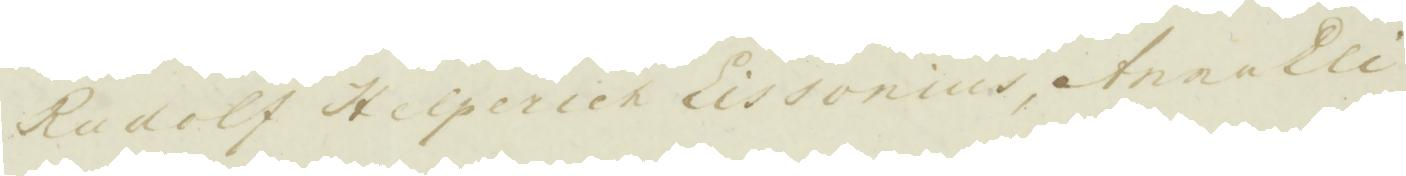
Rudolf Helperich Eissonius, Anna Eli
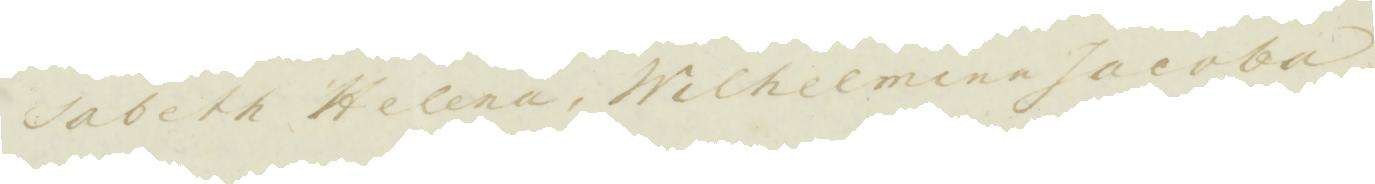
sabeth Helena, Wilhelmina Jacoba
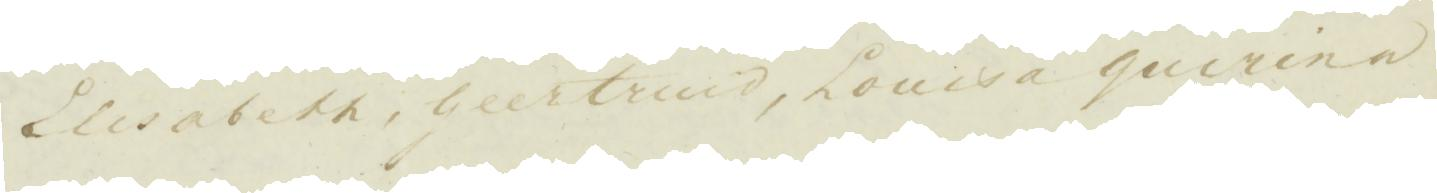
Elisabeth, Geertruid, Louisa querina
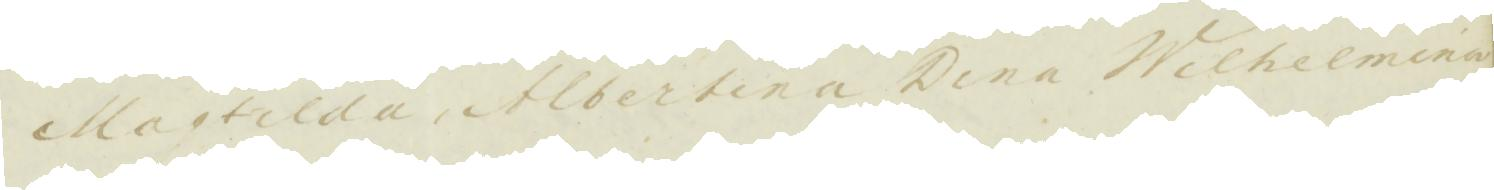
Magtilda, Albertina Dina Wilhelmina,
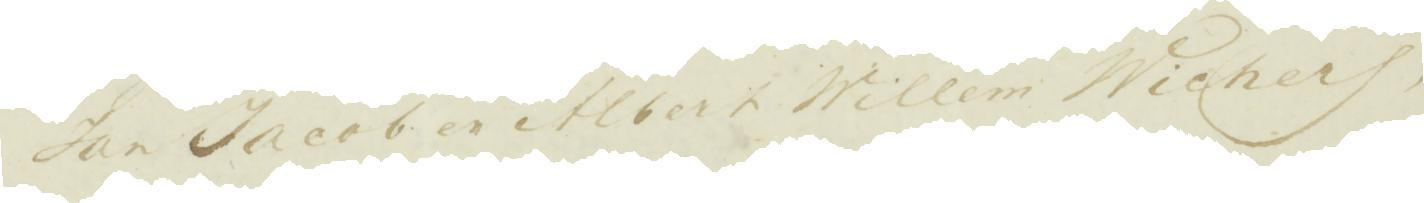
Jan Jacob en Albert Willem Wichers,
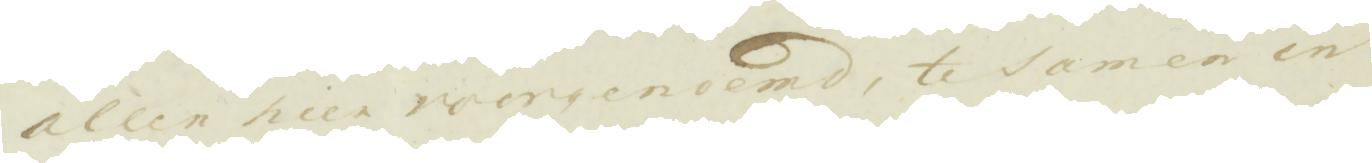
allen hier voorgenoemd, te samen en
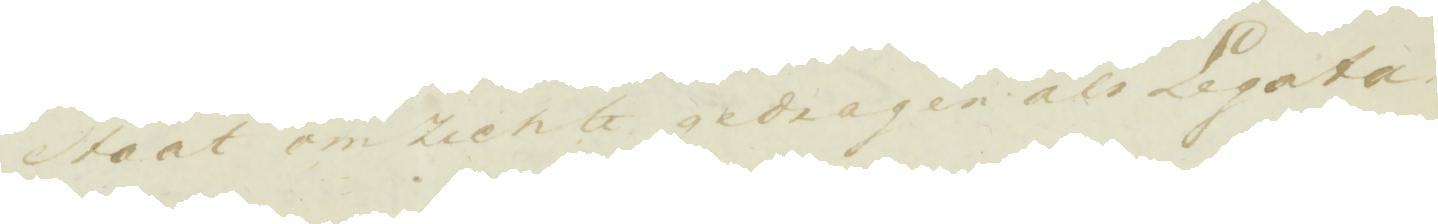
staat om zich te gedragen als Legata
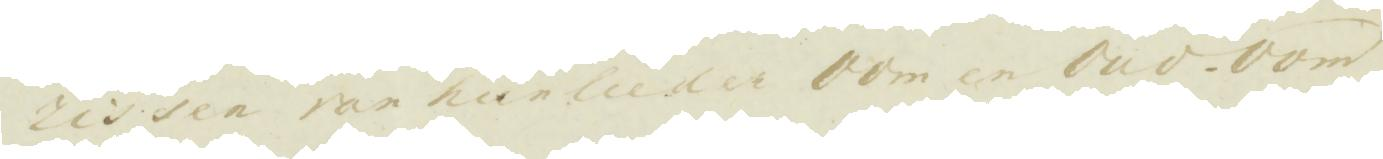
rissen van hun lieder oom en oud-oom
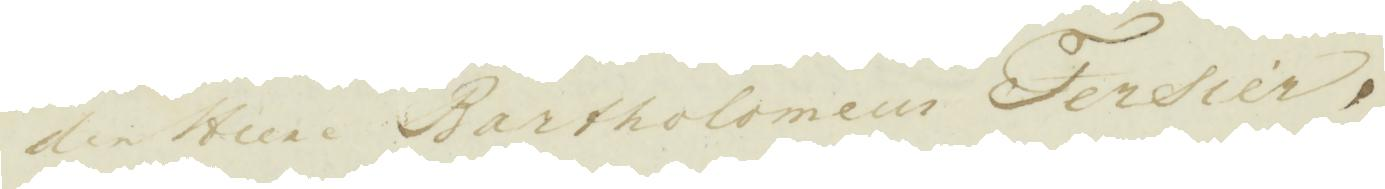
den Heere Bartholomeus Tersier,
